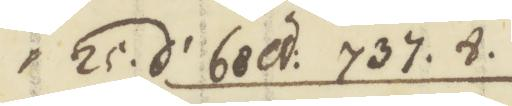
„ 25. d' 68lb: 737. 8.
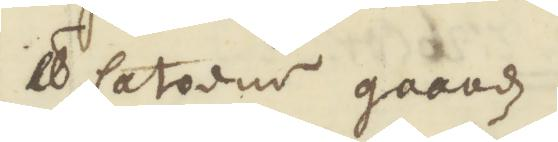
lb Catoene gaaren
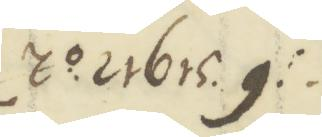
r:o 21615. 9:
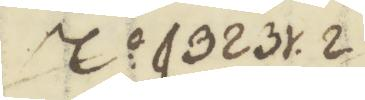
r:o 43231. 2
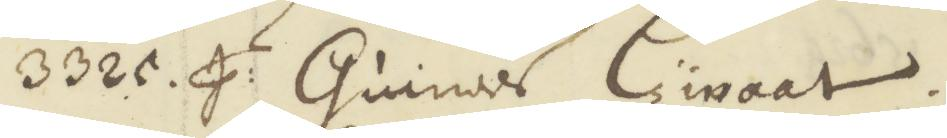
3325. p:s Guinees Lijwaat
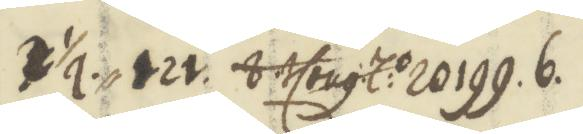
2¼1„ 121. 8 tcorg. r:o 20199. 6.
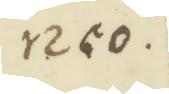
1250.
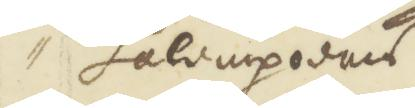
„ Salempoeris
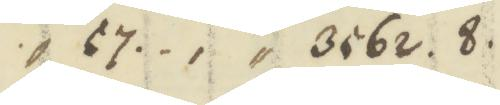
. „ 57. - „ „ 3562. 8
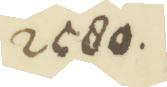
2580.
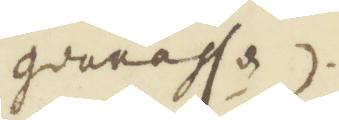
gerrassen
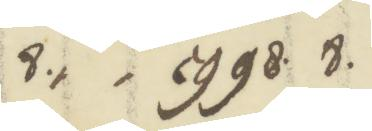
8. „ „ 5998. 8.
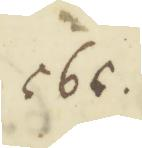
565.
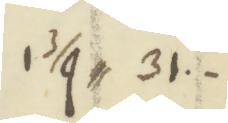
1¾„ 31. –
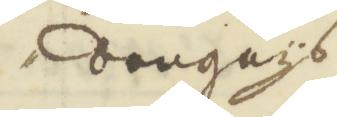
„ dongrijs
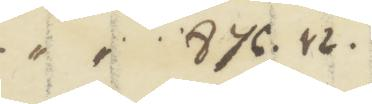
„ „ 875.12.
